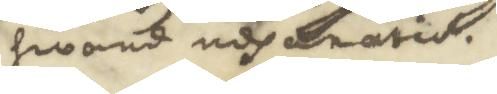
sware reparatie.
